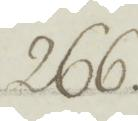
266.
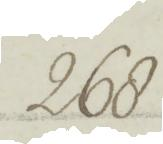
268
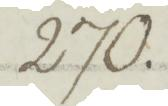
270.
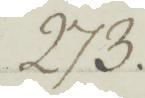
273.
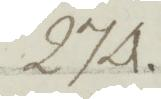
274.
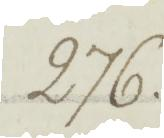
276.
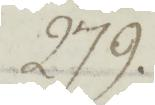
279.
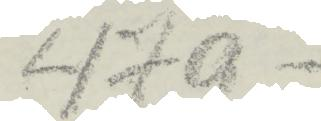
479 -
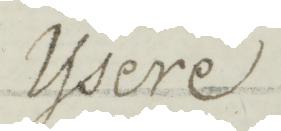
Ysere.
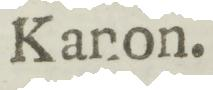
Kanon.
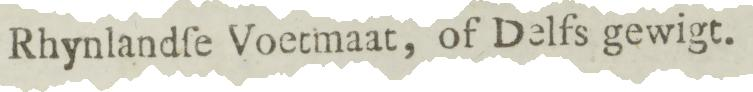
Rhynlandse Voetmaat, of Delfs gewigt.
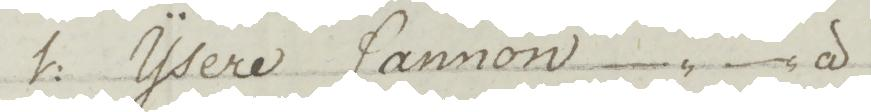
1: IJsere Cannon —„— a
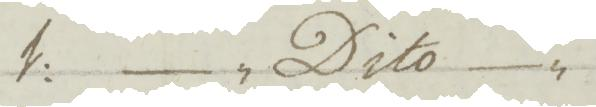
1: —„ Dito —„
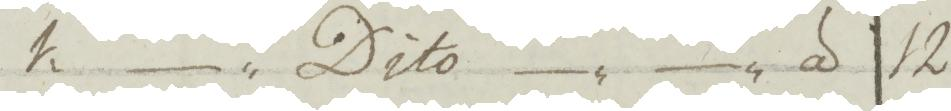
1: —„ Dito —„ —„ a 12
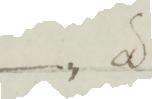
—„ a
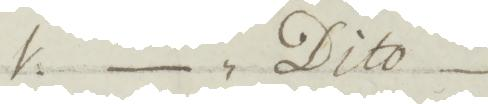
1: —„ Dito -
